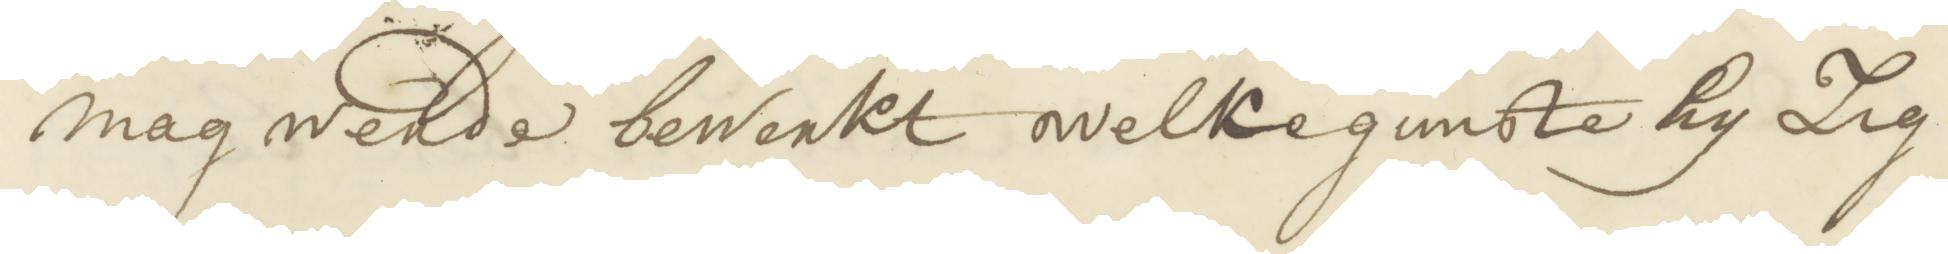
mag werde bewerkt welke gunste hij zig
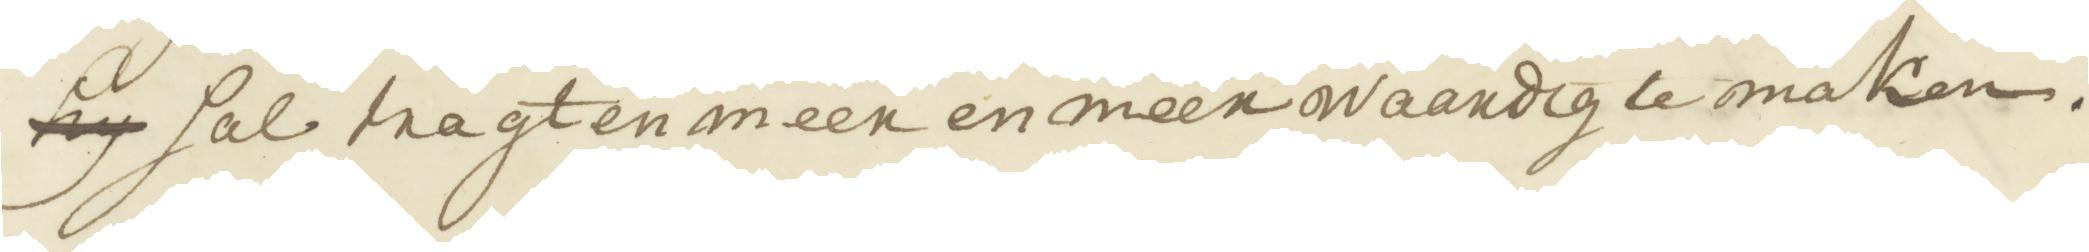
hy sal tragten meer en meer waardig te maken.
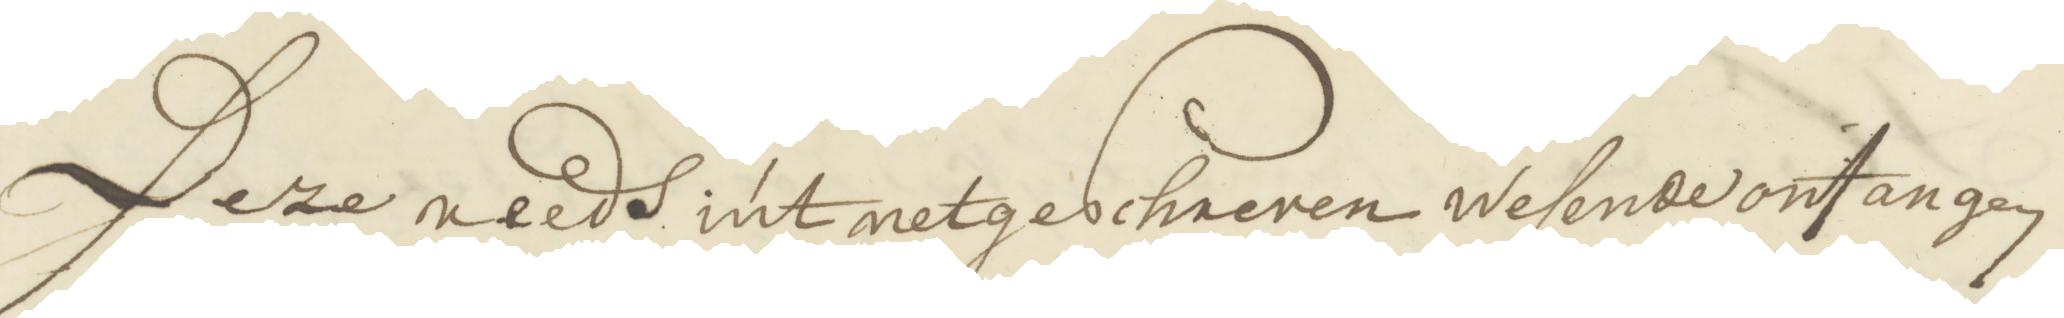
Deze reeds in't netgeschreven wesende onfangen
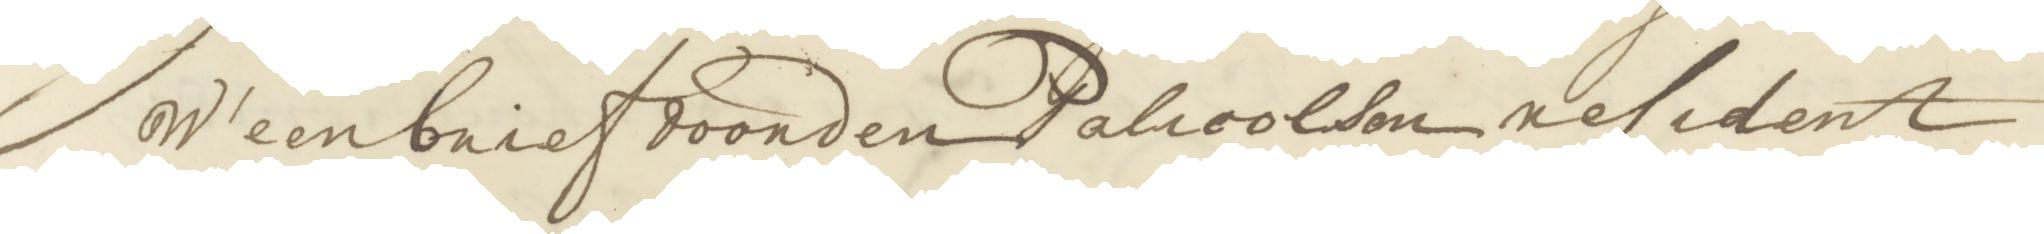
w'een brief doorden Palicolsen resident
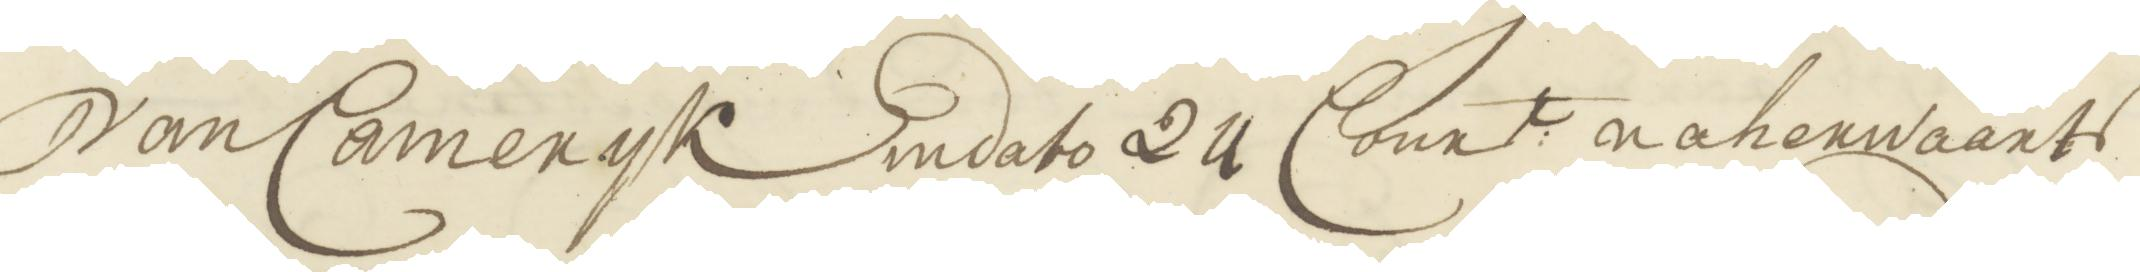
van Cameryk indato 24 Cour:t naherwaarts
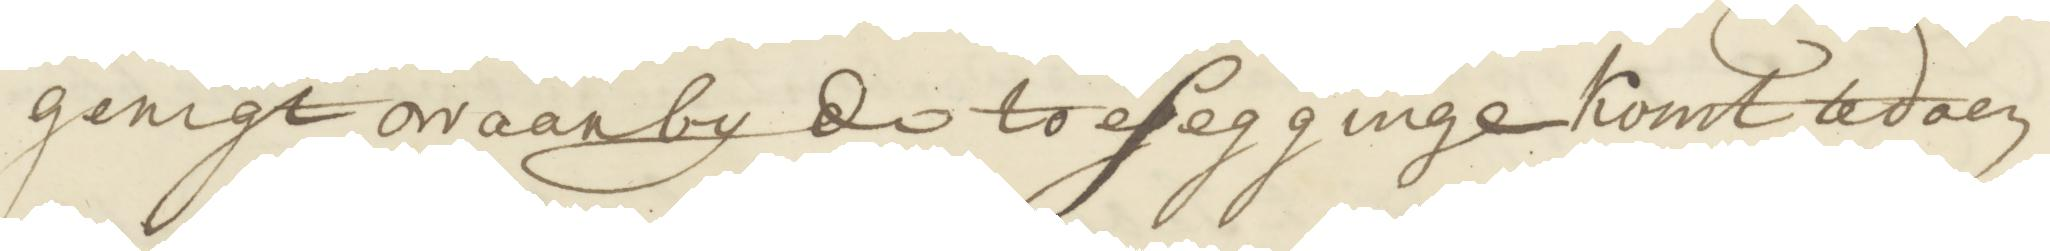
gerigt waar bij de toesegginge komt tedoen
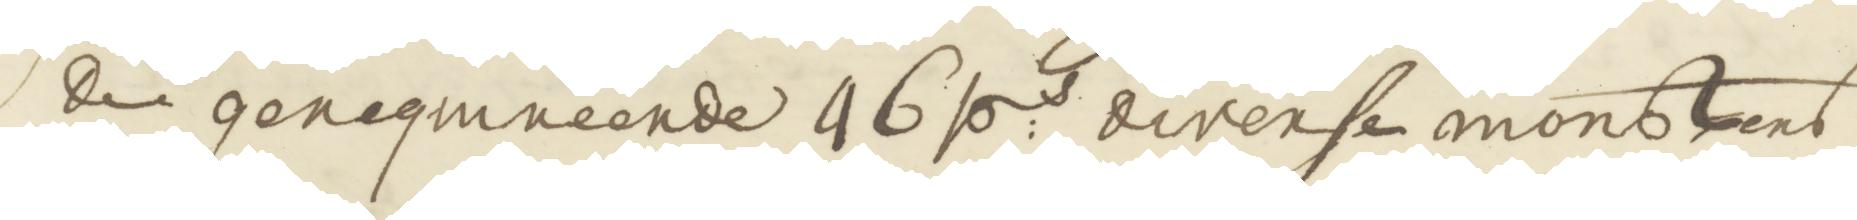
de gerequireerde 46 p:s diverse monsters
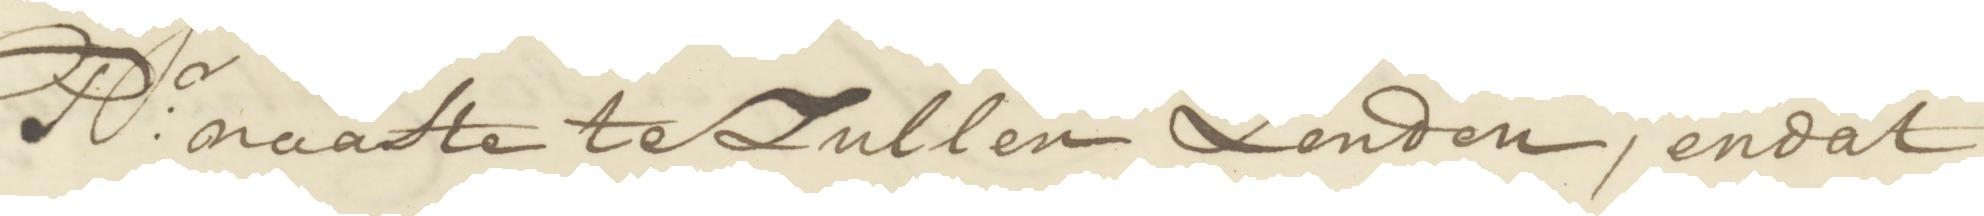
P:o naaste te zullen zenden, en dat
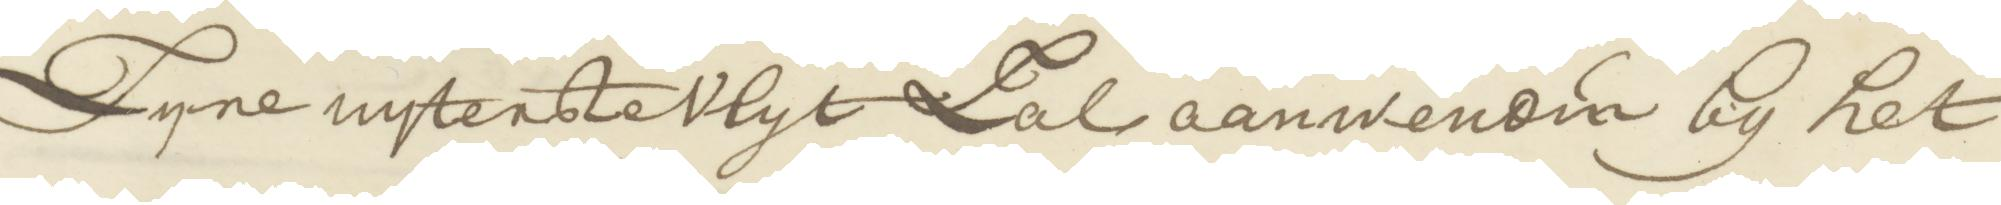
zyne uyterstevlyt zal aanwendun by het
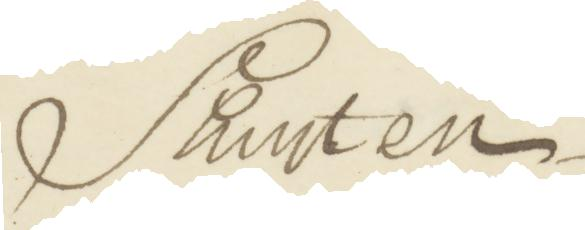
Sluyten
